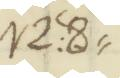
12:8„
